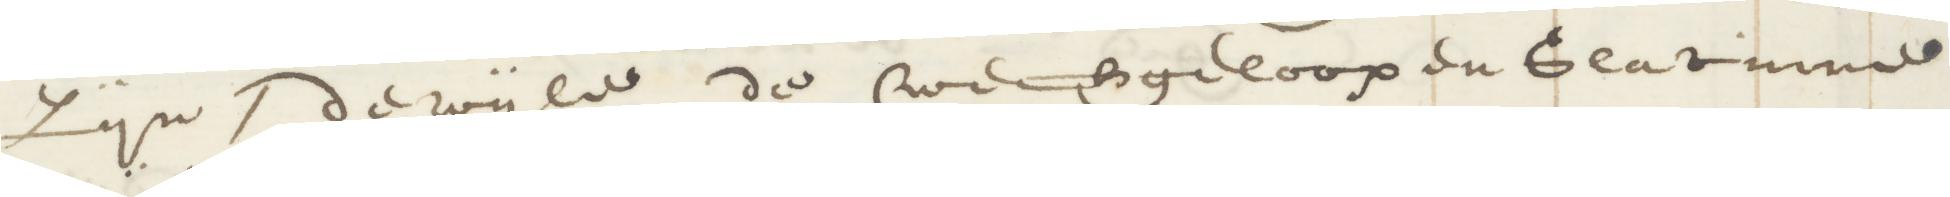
zijn, dewijle de wechgeloopen Slavinne
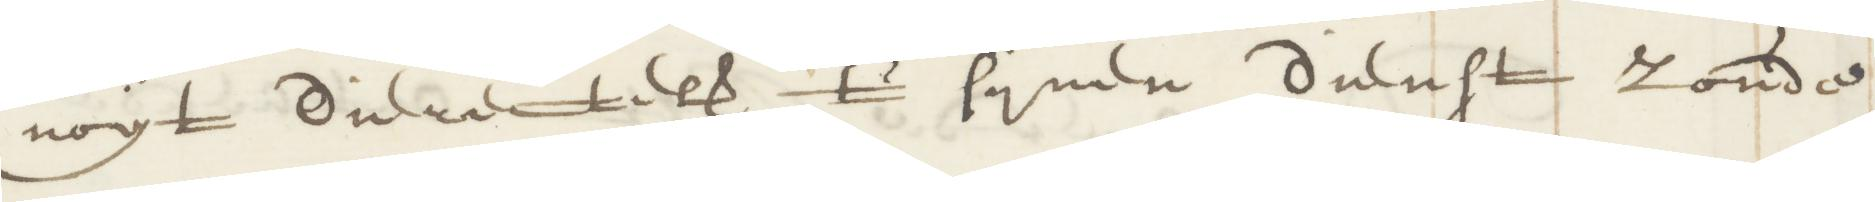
noijt dierectelijk t' sijnen dienst zoude
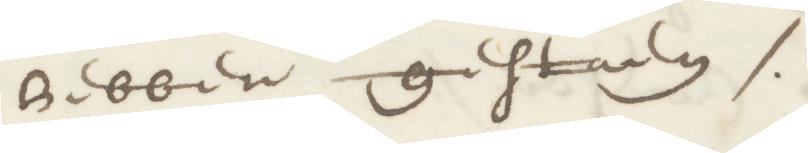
hebben gestaen/.
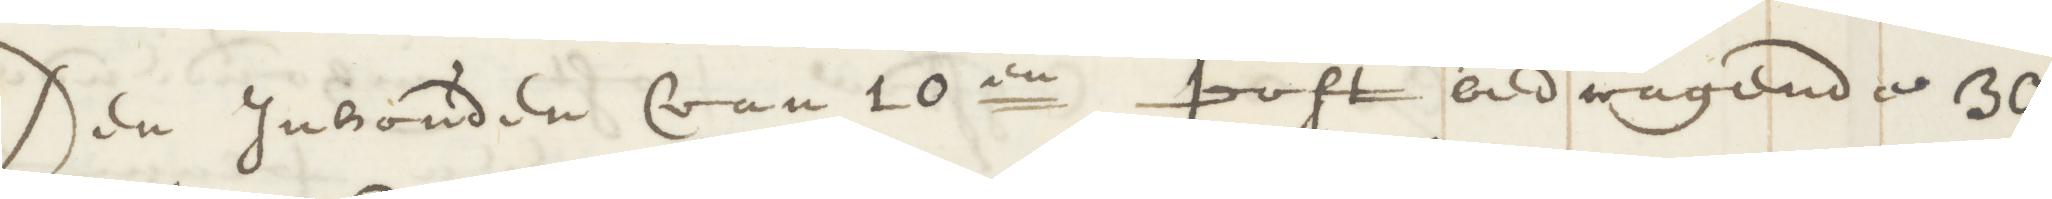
Den Jnhouden van 10=en post bedragende 30
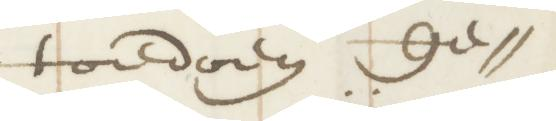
toedoen ge„
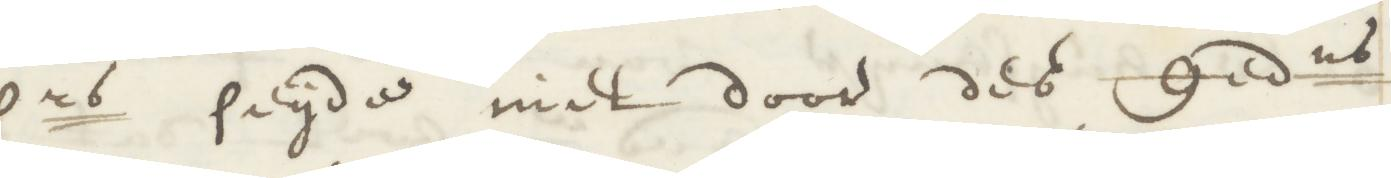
=rs seijde niet door des ged=ns
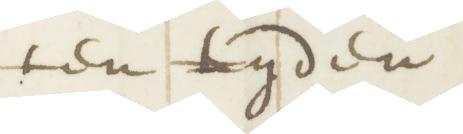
ten tijden
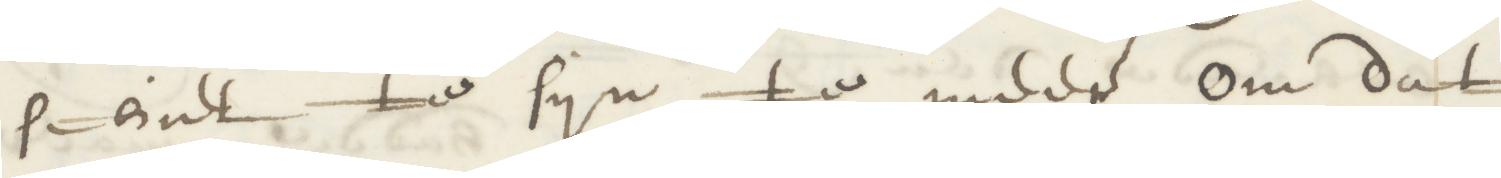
schiet te sijn te meer om dat
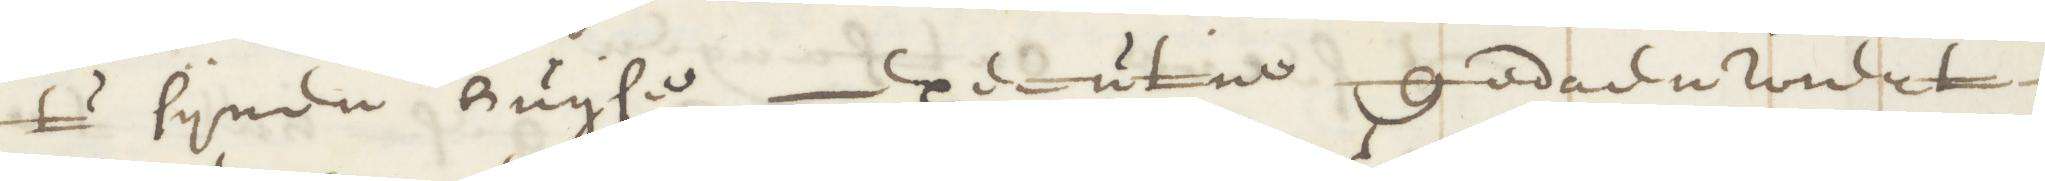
t' sijnen huijse executie gedaen wiert
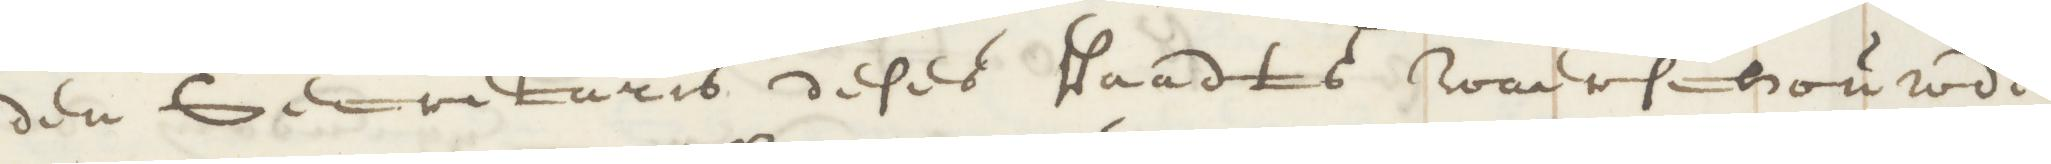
den Secretaris deses Raadts waerschouwde
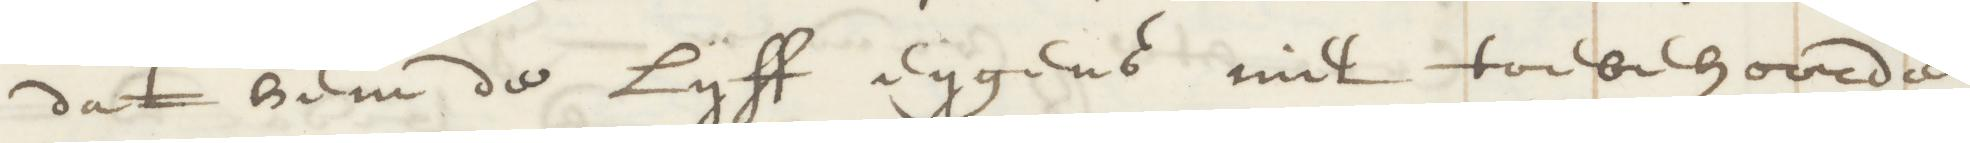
dat hem de Lijff eijgens niet toebehoorde
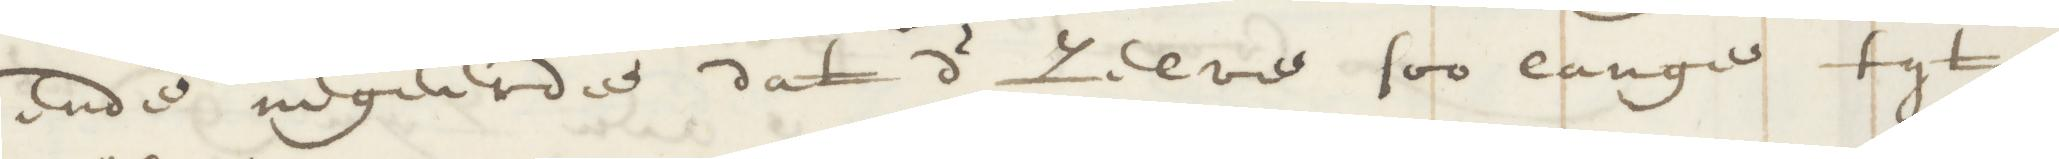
ende negeerde dat d’ zelve soo lange tijt
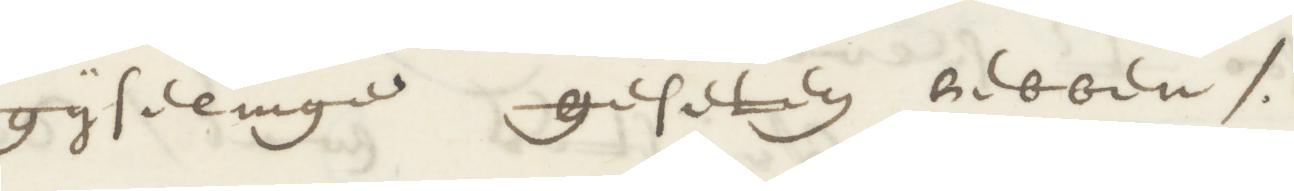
gijselinge geseten heboen/.
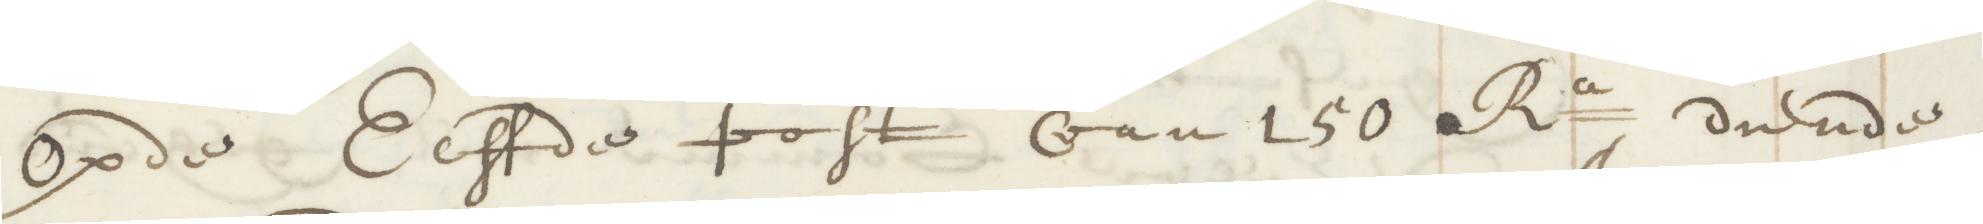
Op de Elffde post van 150 R=a diende
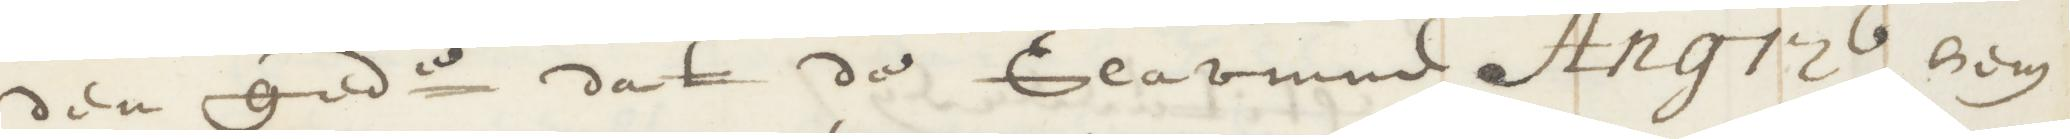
den ged=e dat de Slavinne Angie hem
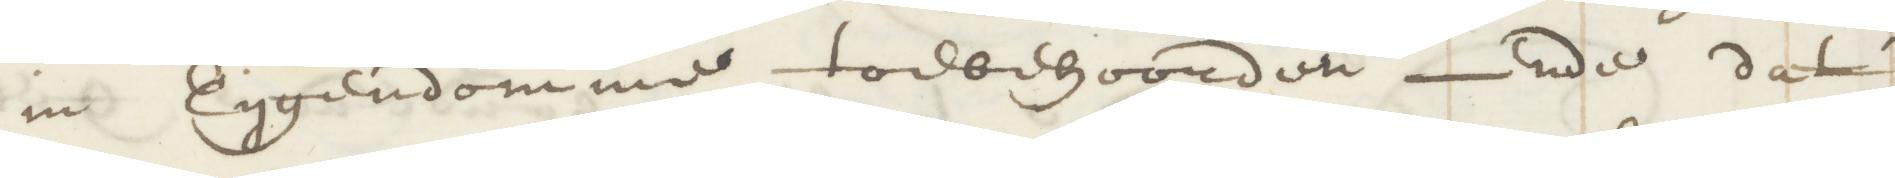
in Eijgendomme toebehoorden ende dat
